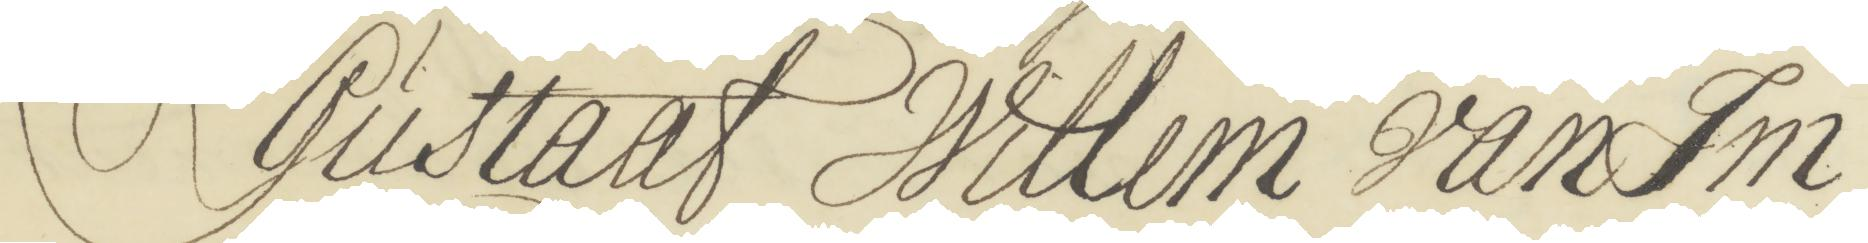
Gustaaf Willem van Im
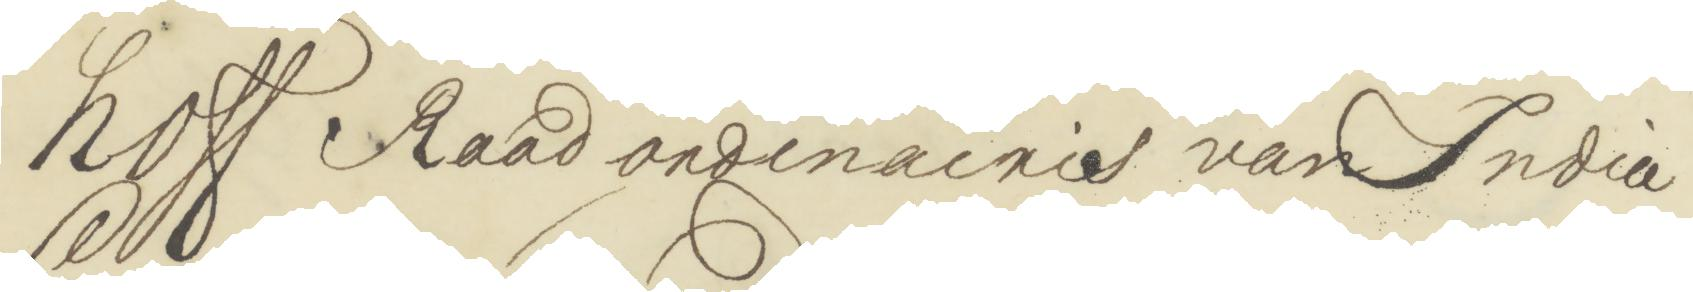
hoff Raad ordinairis van India
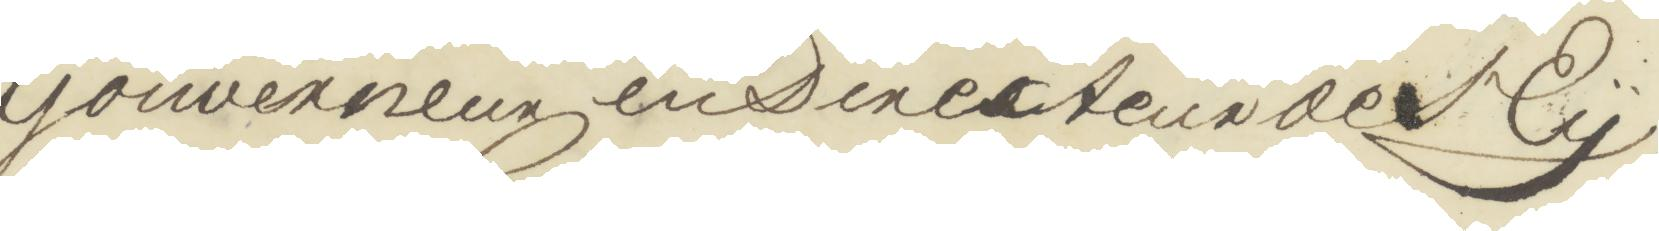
Gouverneur en Directeur des Eij
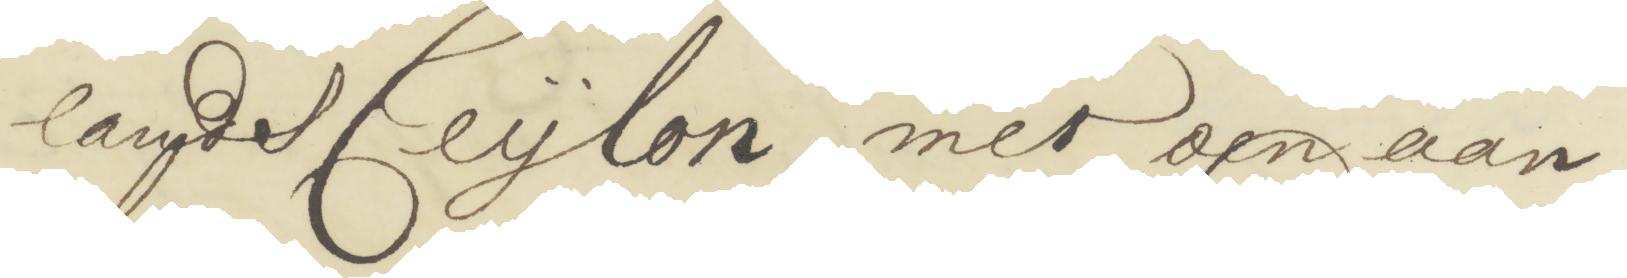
lands Ceijlon, met den aan
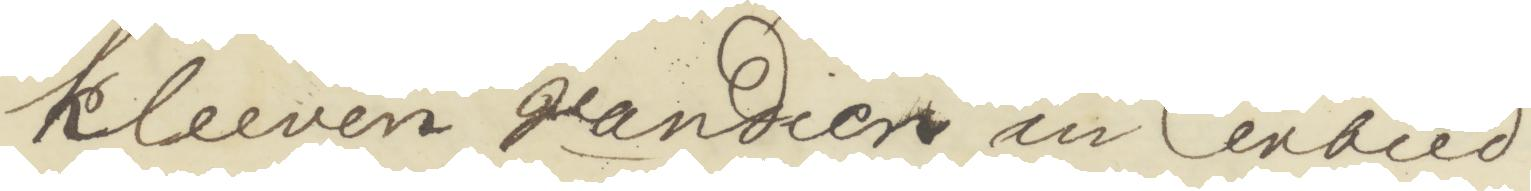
kleeven vandien in Eerbied
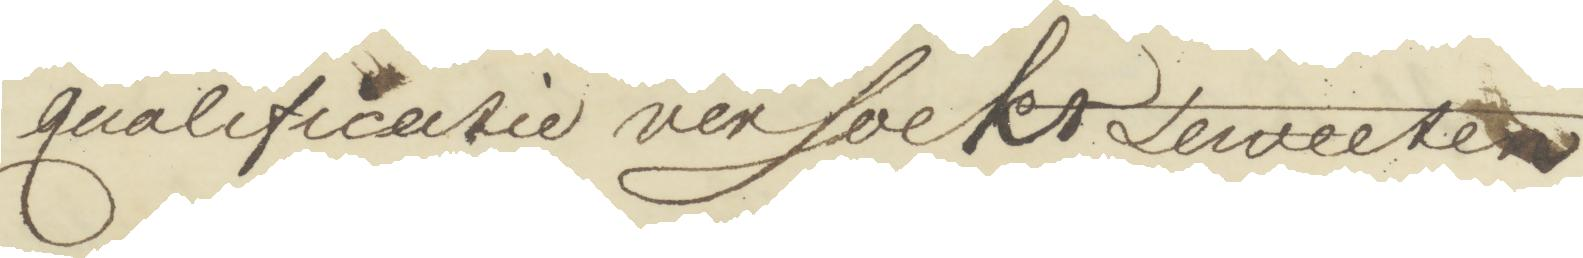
qualificatie versoekt teweeten
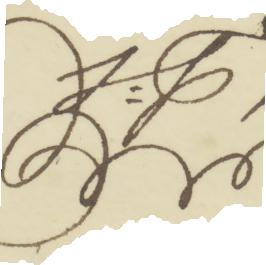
1: p„s
